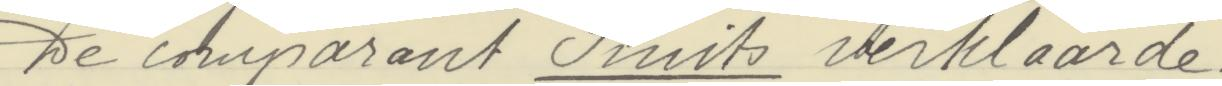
De comparant Smits verklaarde
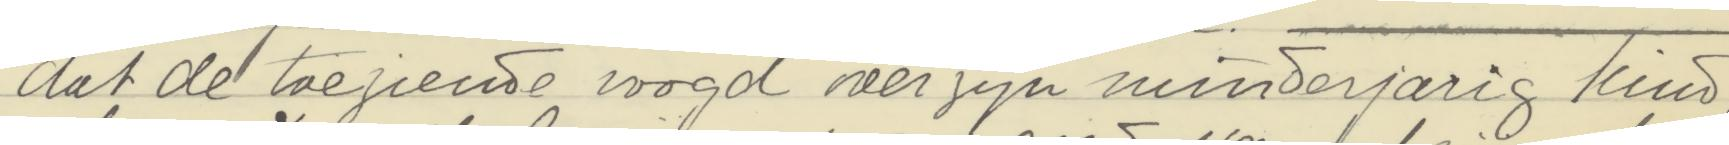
dat de toeziende voogd over zijn minderjarig kind
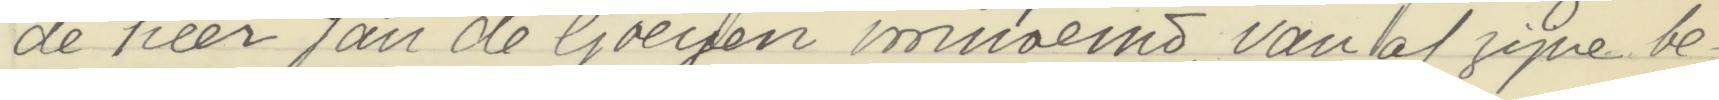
de heer Jan de Goeijen voornoemd, van af zijne be
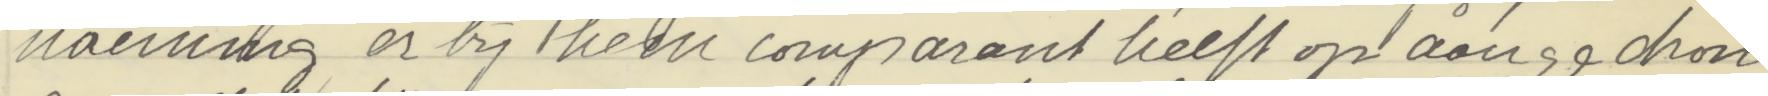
noeming, en bij hem comparant heeft op aangedron
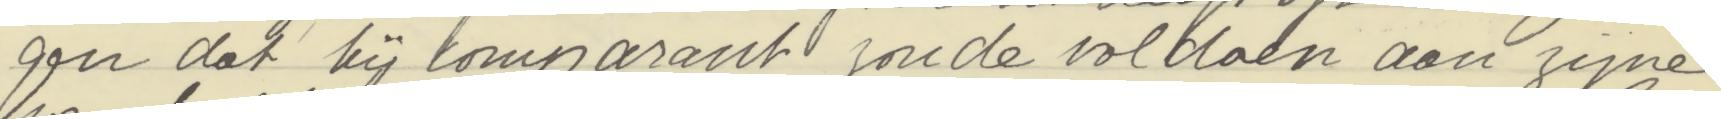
gen dat bij comparant zoude voldoen aan zijne
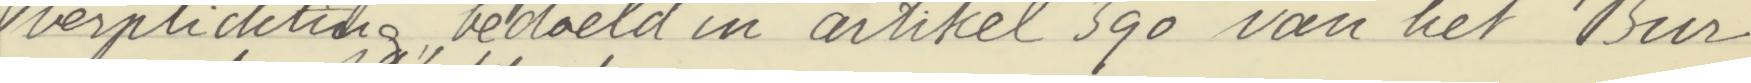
verplichting, bedoeld in artikel 390 van het Bur
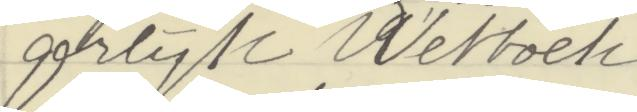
gerlijk Wetboek
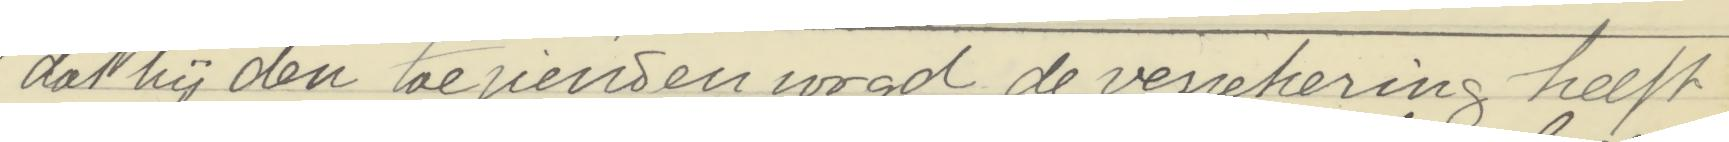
dat hij den toezienden voogd de verzekering heeft
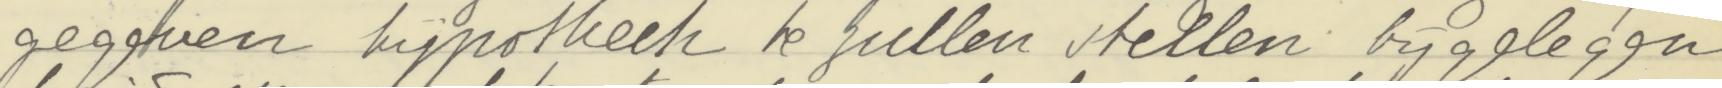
gegeven hijpotheek te zullen stellen bij gelegen
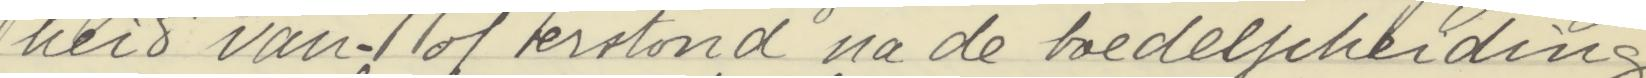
heid van of terstond na de boedelscheiding
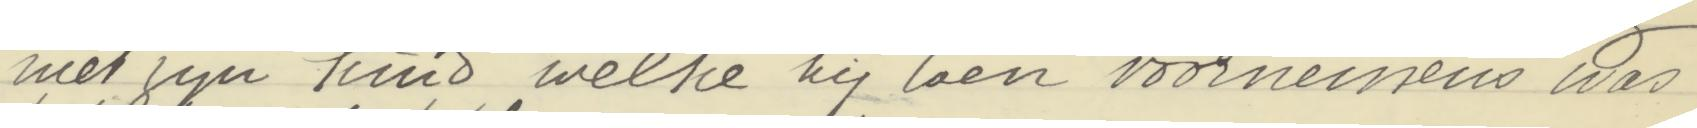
met zijn kind, welke hij toen voornemens was
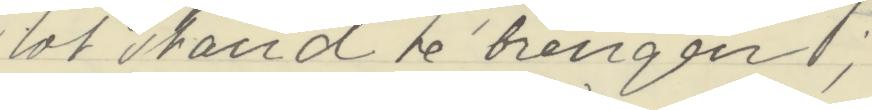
tot stand te bengen;
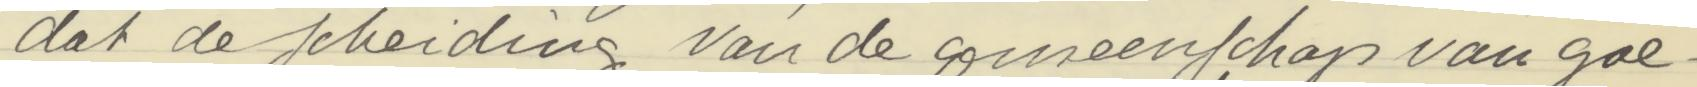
dat de scheiding van de gemeenschap van goe
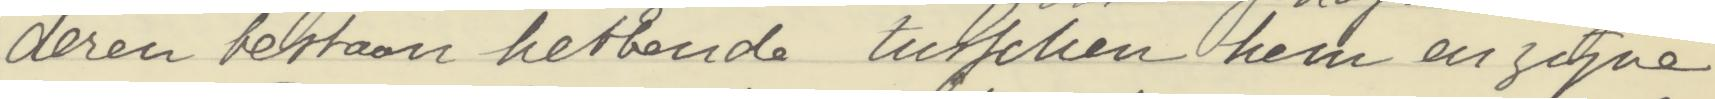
deren bestaan hebbende tusschen hem en zijne
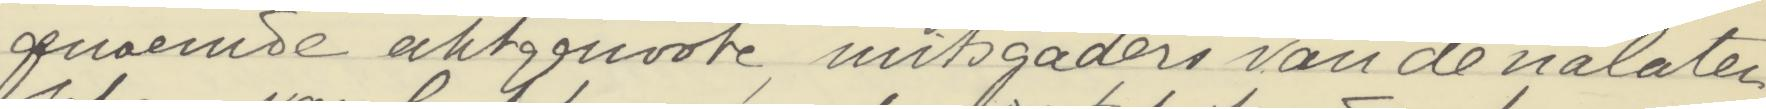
genoemde echtgenoote mitsgaders van de nalaten
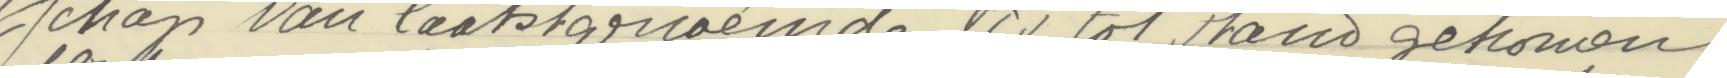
schap van laatstgenoemde is tot stand gekomen
